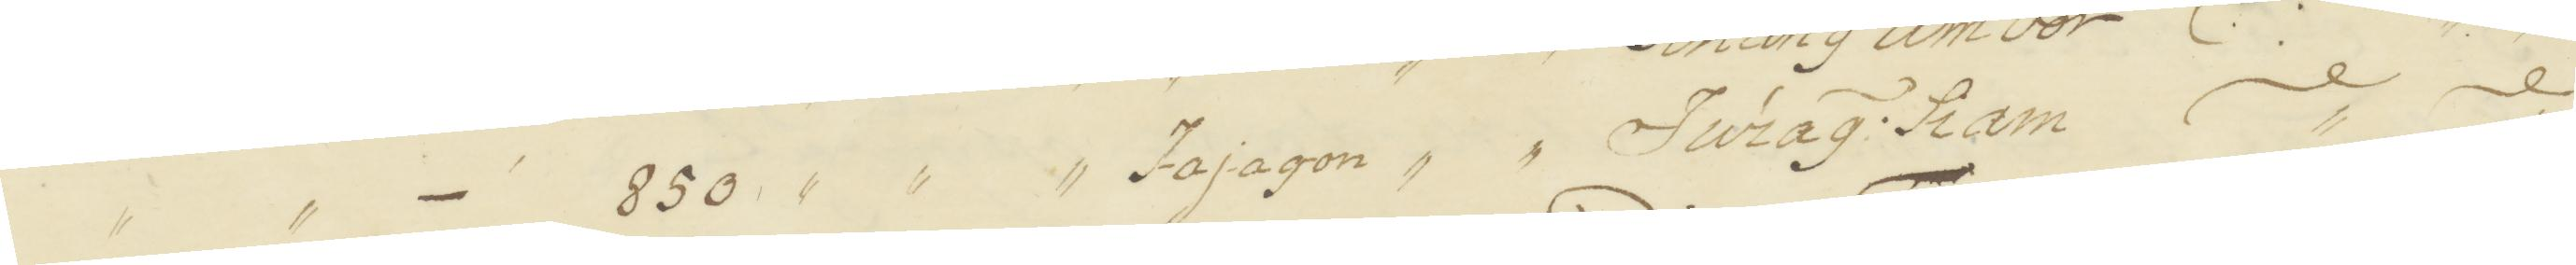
„ „ — 850 „ „ „ Iajagon „ „ Iurag: Siam d„o d„o
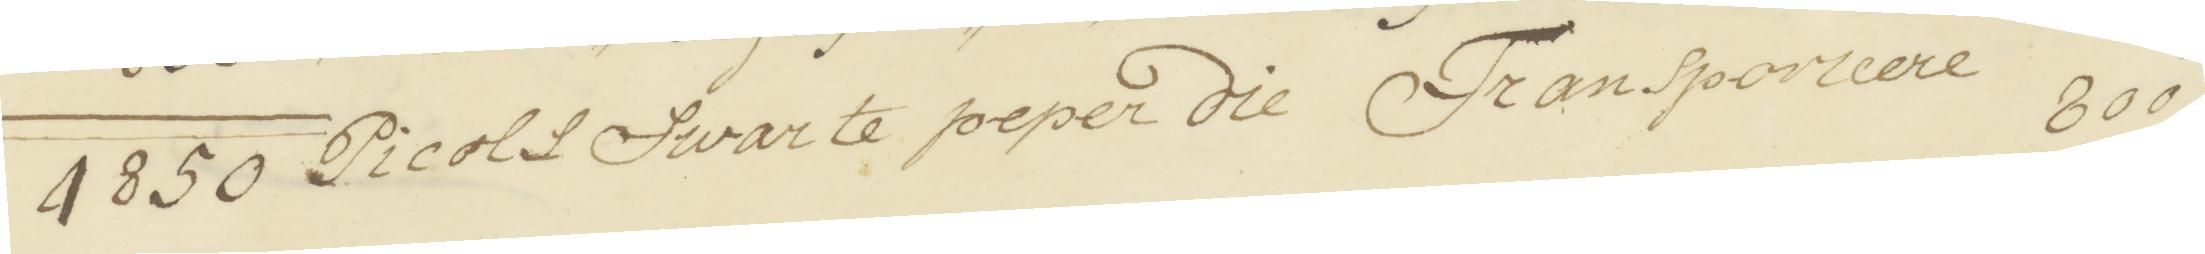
4850 Picols swarte peper die Transporteere 800.
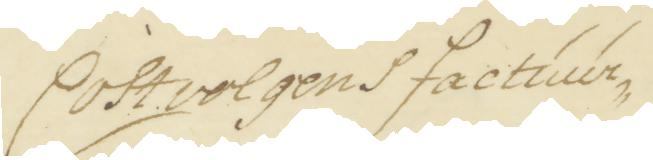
Cost volgens factuur„
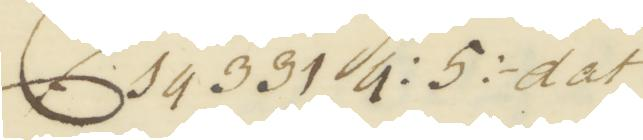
ƒ 143314: 5: — dat bezij
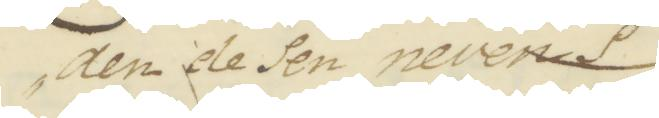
„den desen nevens
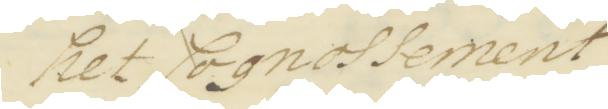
het Cognossement
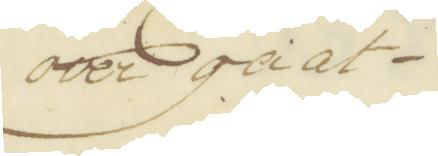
over gaat —
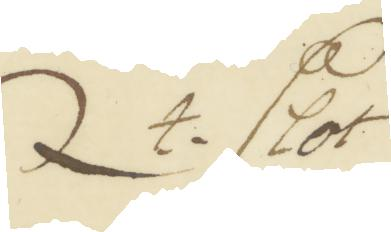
t. Slot
